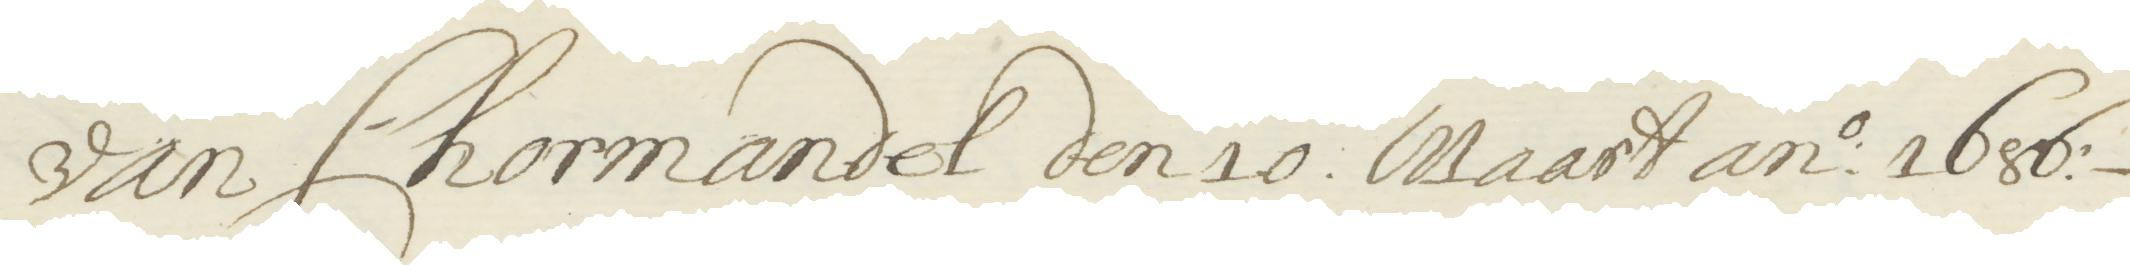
Van Chormandel den 10:' Maart an:o 1686:
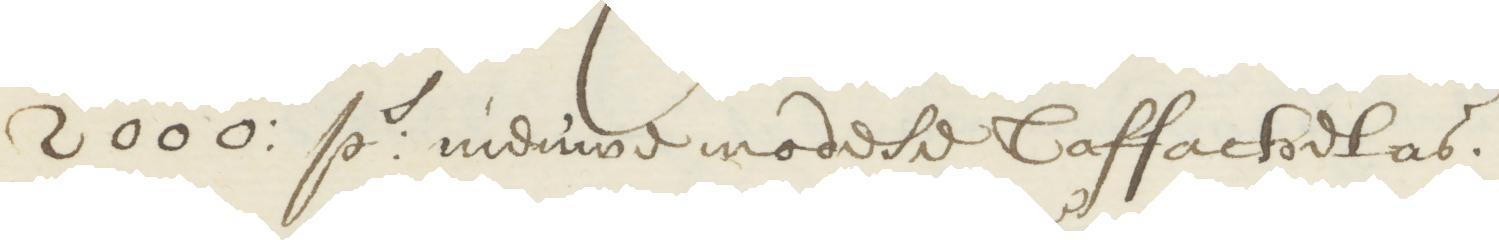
2000: p:s nieuwe modese Taffachelas.
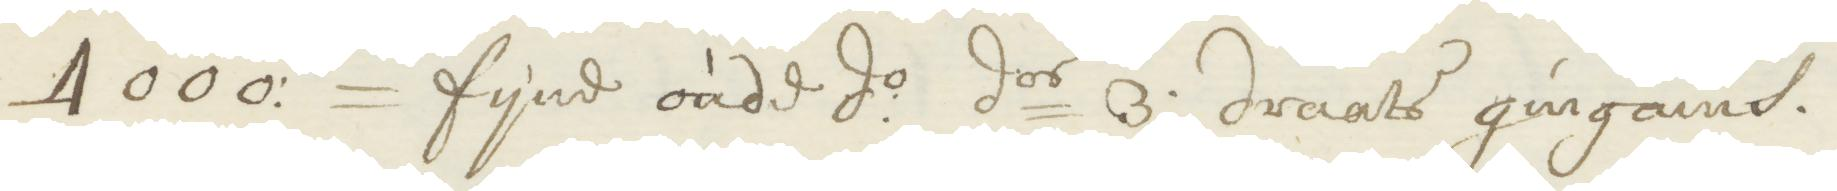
4000: = fijne oude d:o d=os 3: draats gingams.
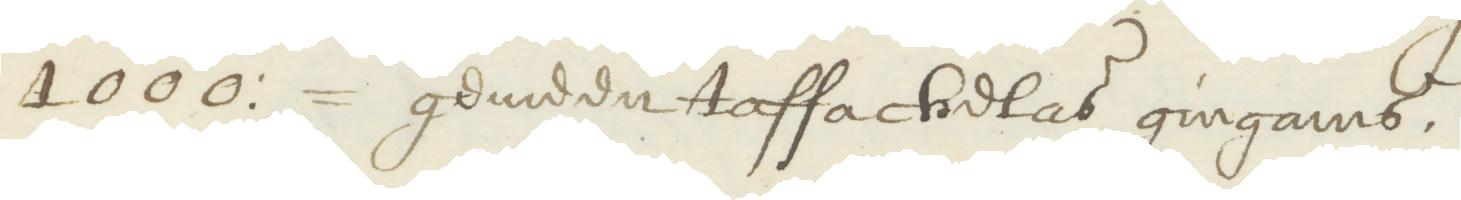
1000: = gemeen taffachelas gingams.
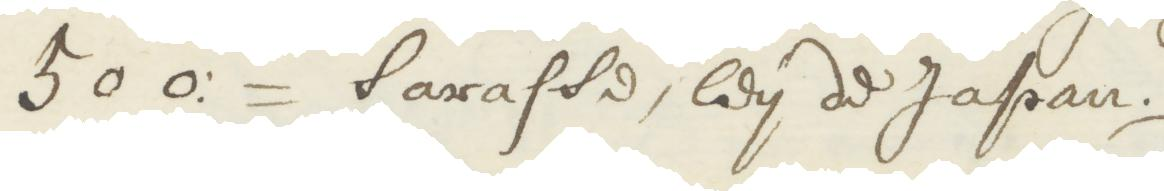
500: = sarasse, ley de Japan.
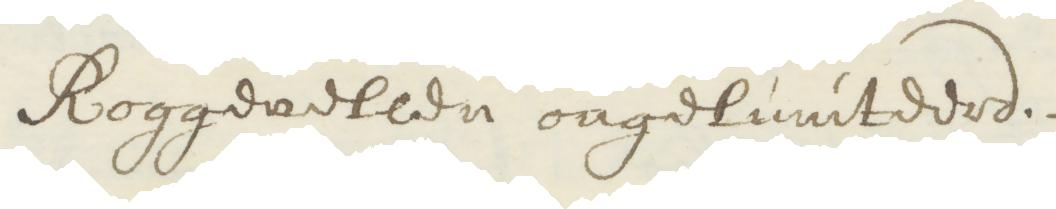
Roggevellen ongelimiteerd.
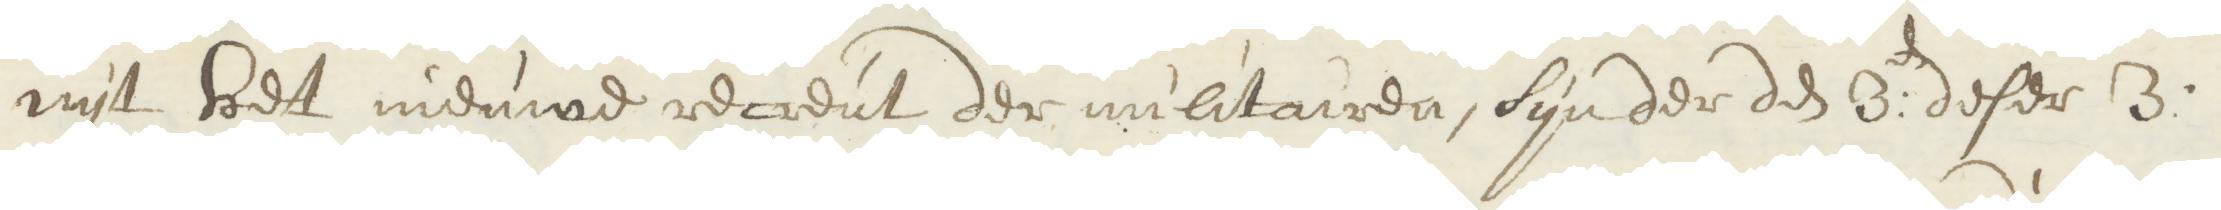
uijt het nieuwe recreut der militairen, sijn der den 3:en deser 3:
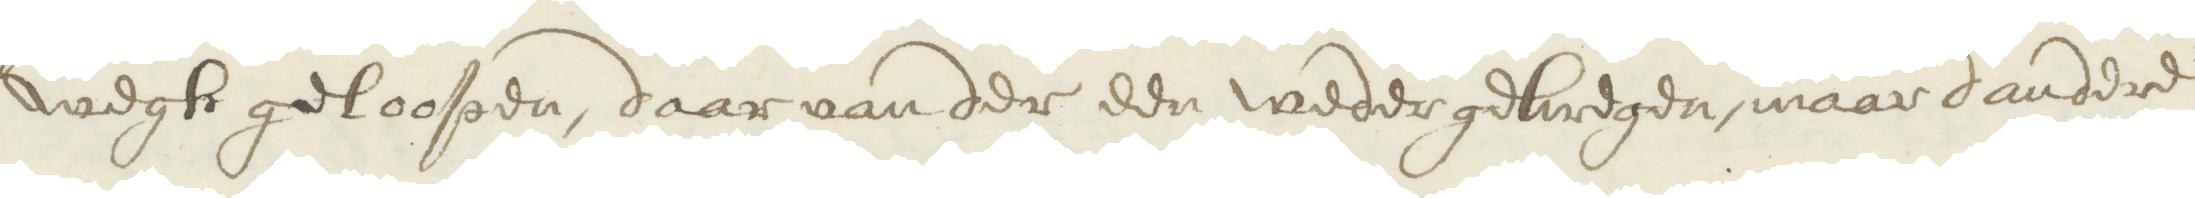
wegh geloopen, daar van der een weder gekregen, maar d'andere
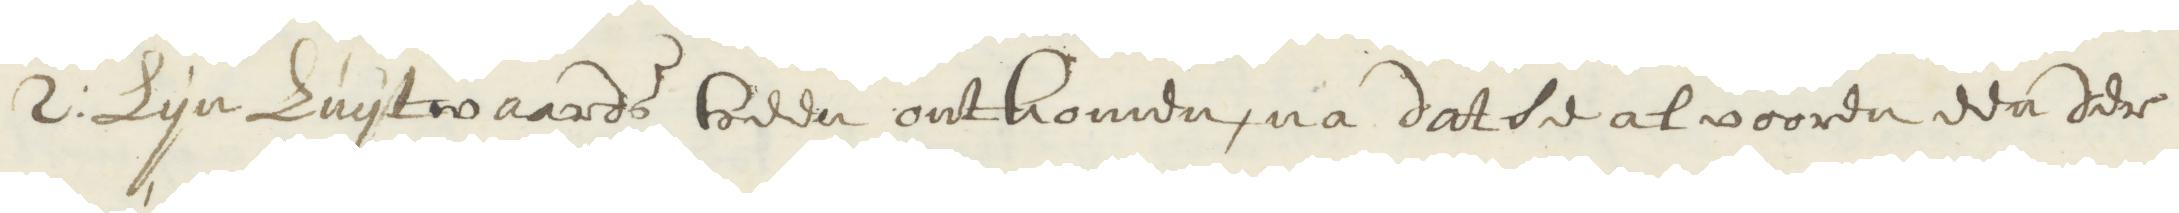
2: zijn Zuijtwaards heen ontkomen, na datse alvooren een der
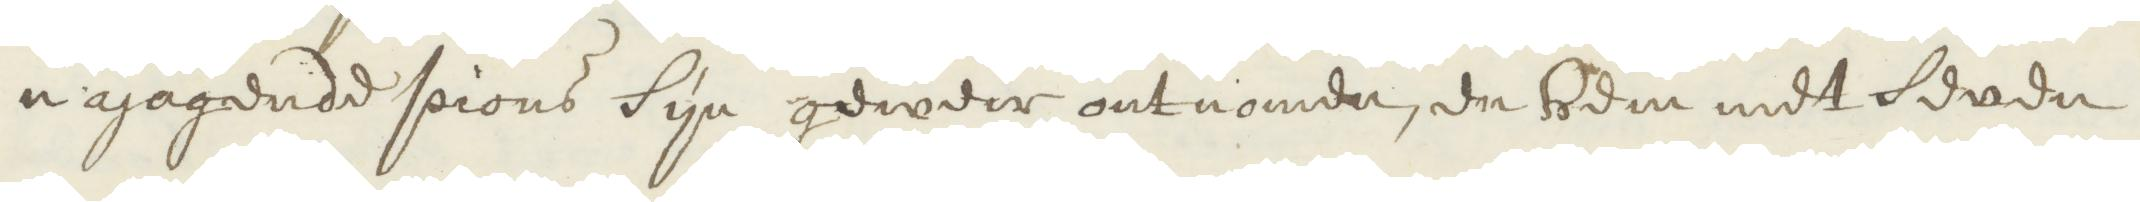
najagende pions sijn geweir ontnomen, en hem met seven
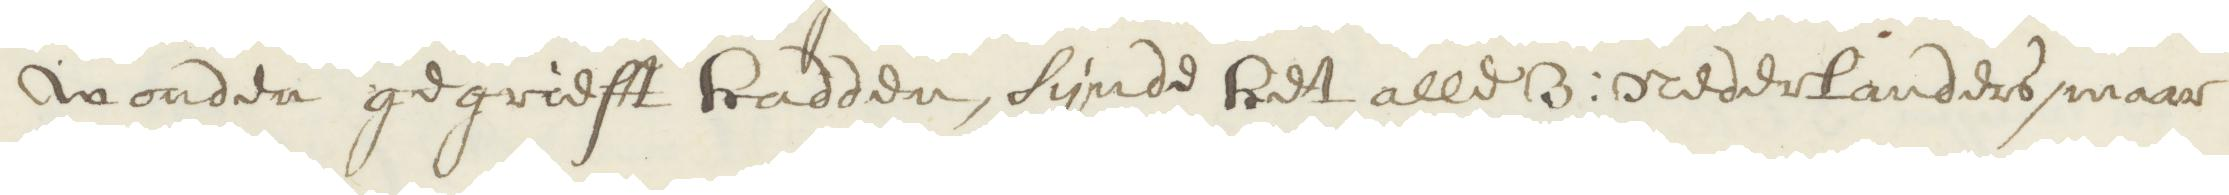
wonden gegrieft hadden, sijnde het alle 3: Nederlanders, maar
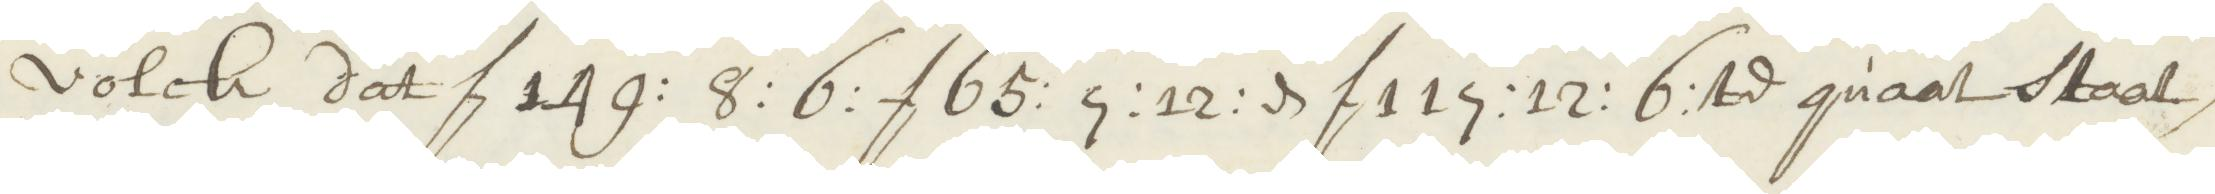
volck dat ƒ149: 8: 6: ƒ65: 7: 12: en ƒ117:12:6: te quaat staat,
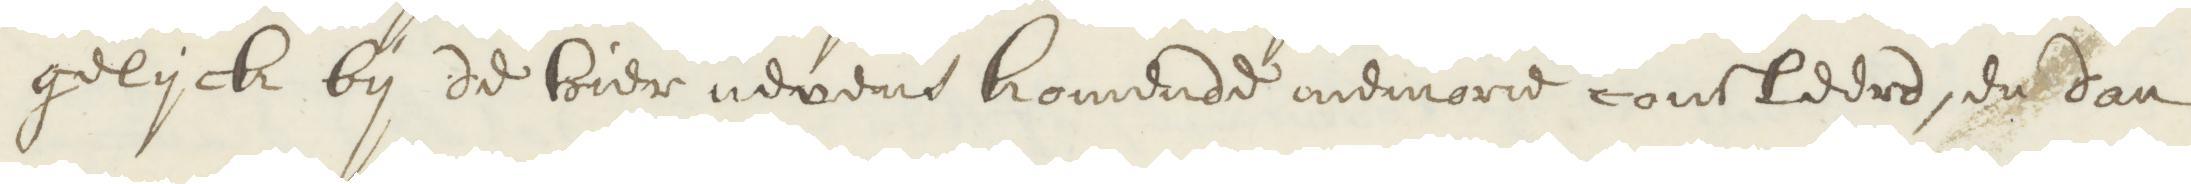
gelijck bij de hier nevens komende memorie consteerd, en dan
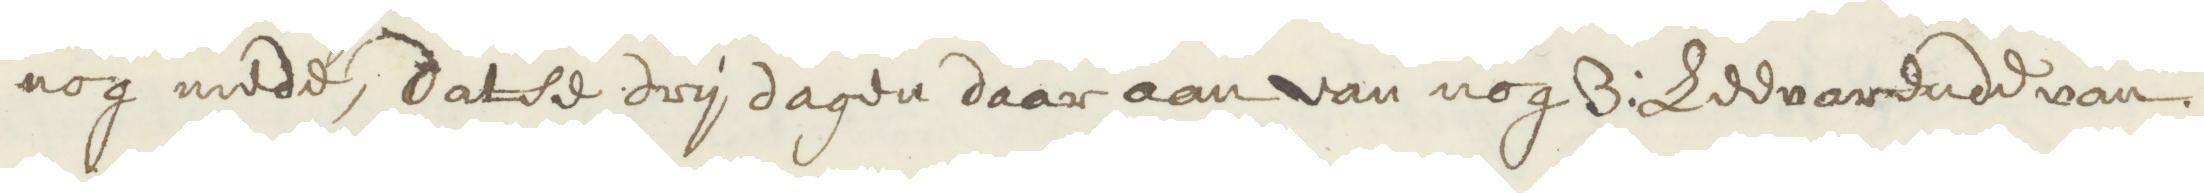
nog mede, datse drij dagen daar aan van nog 3: zeevarende van
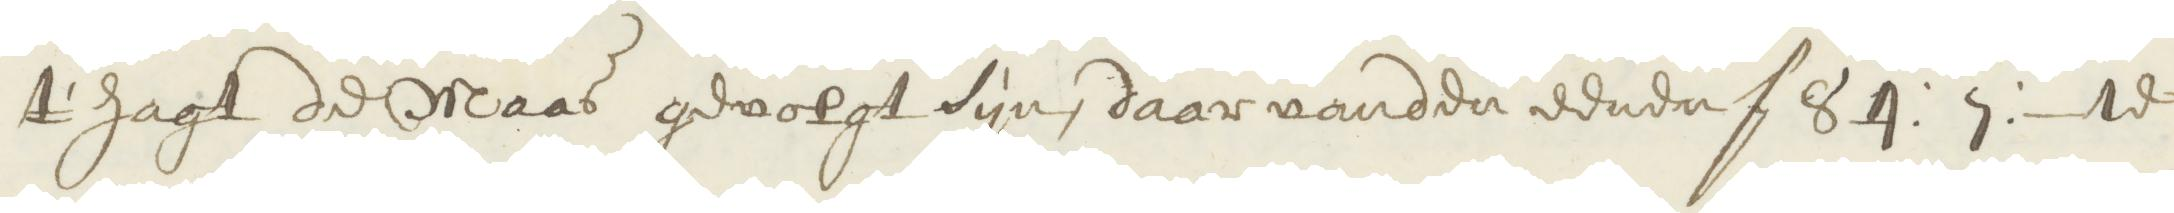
t' Jagt de Maas gevolgt sijn, daar vanden eenen ƒ84:7:— te
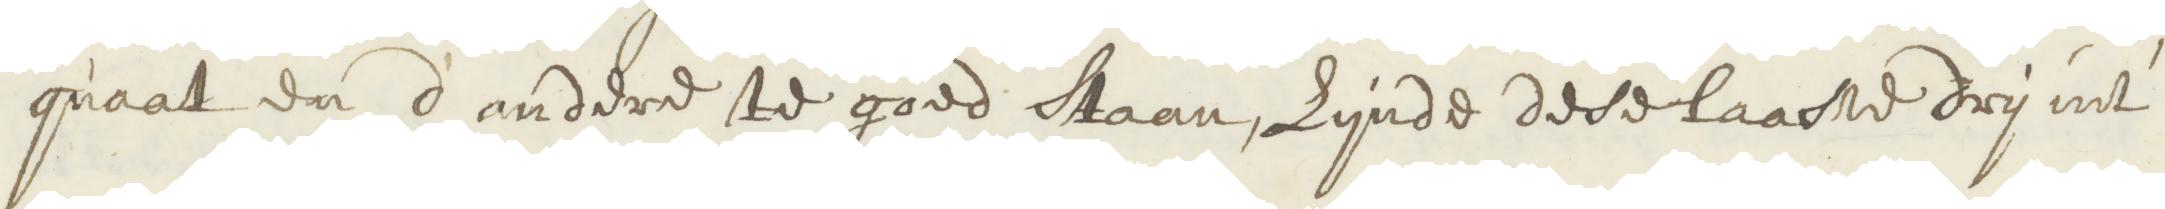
quaat en d’ andere te goed staan, zijnde dese laaste drij int
